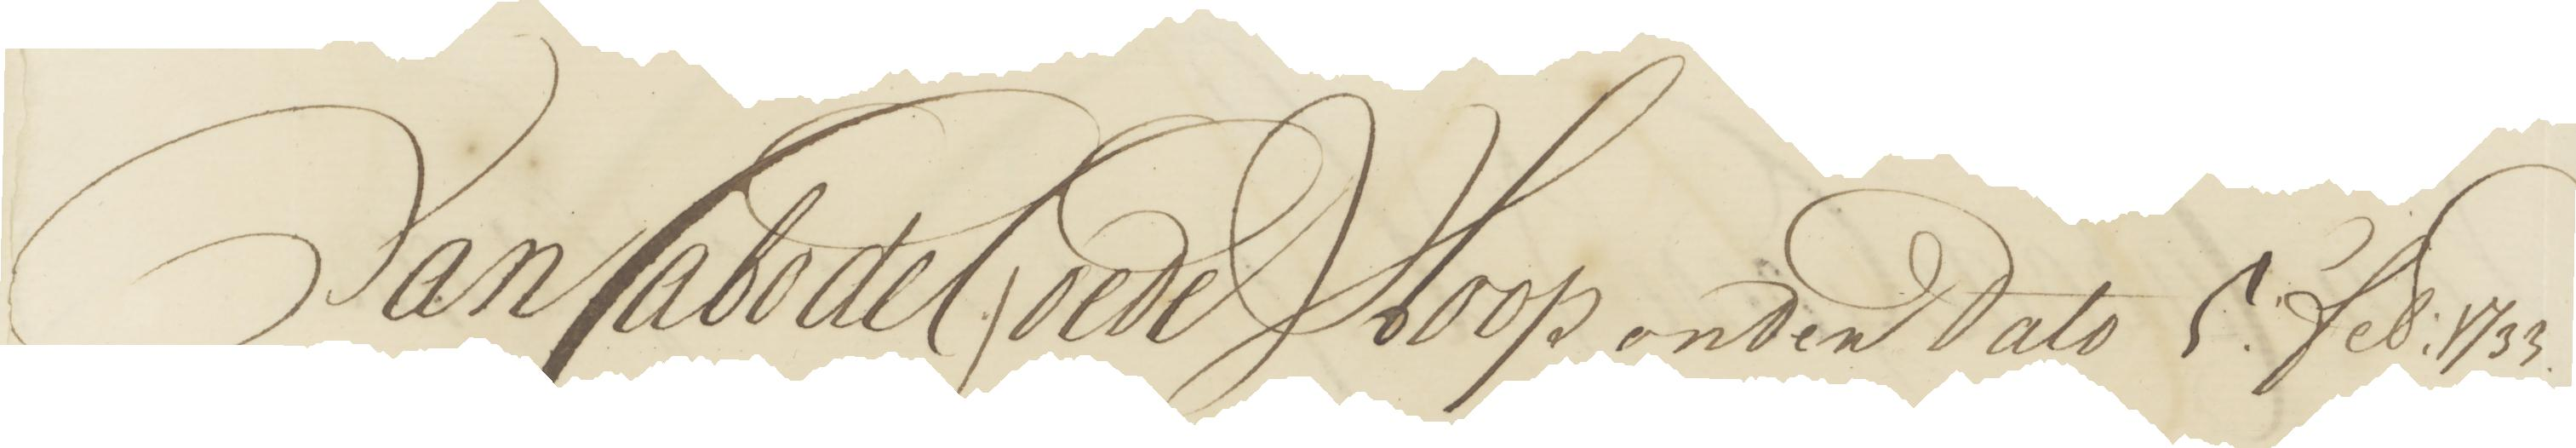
Van Cabode Goede Hoop onder dato 5:' feb: 1733.
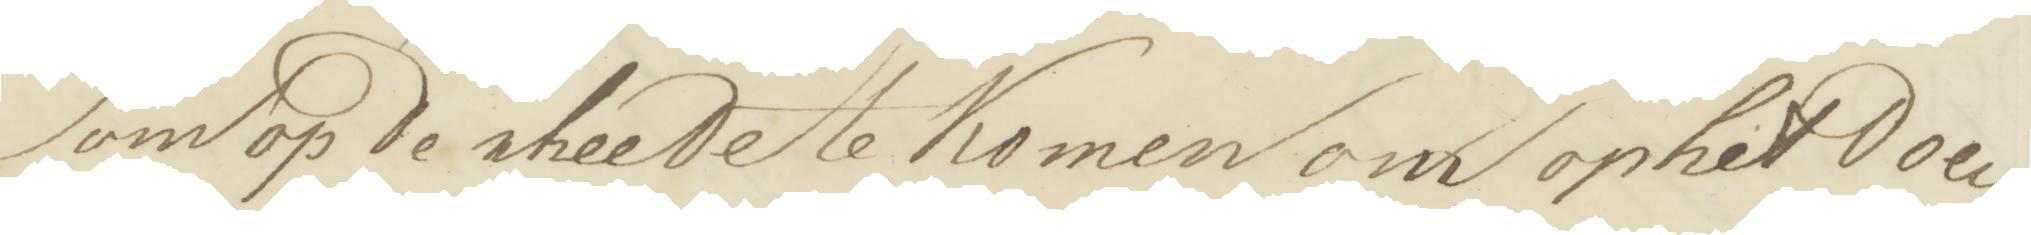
om op de rheede te komen om op het doen
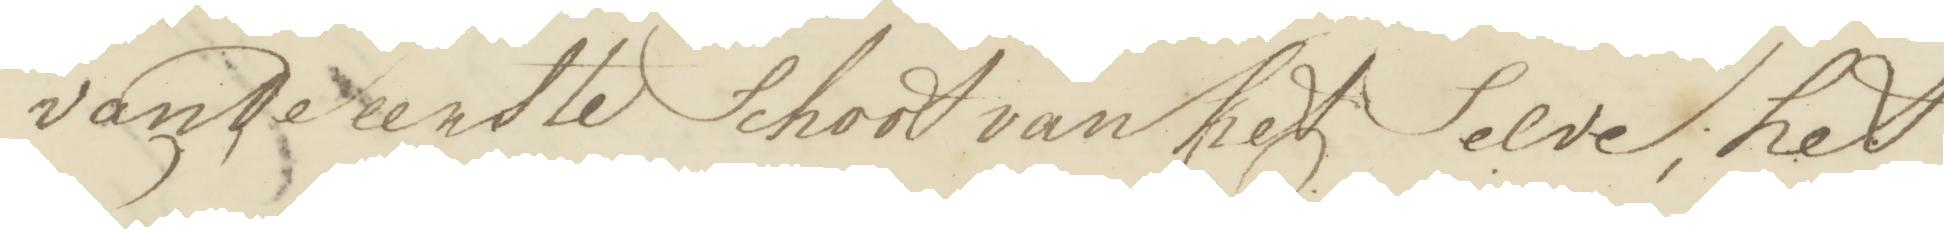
van de eerste schoot van het selve; het
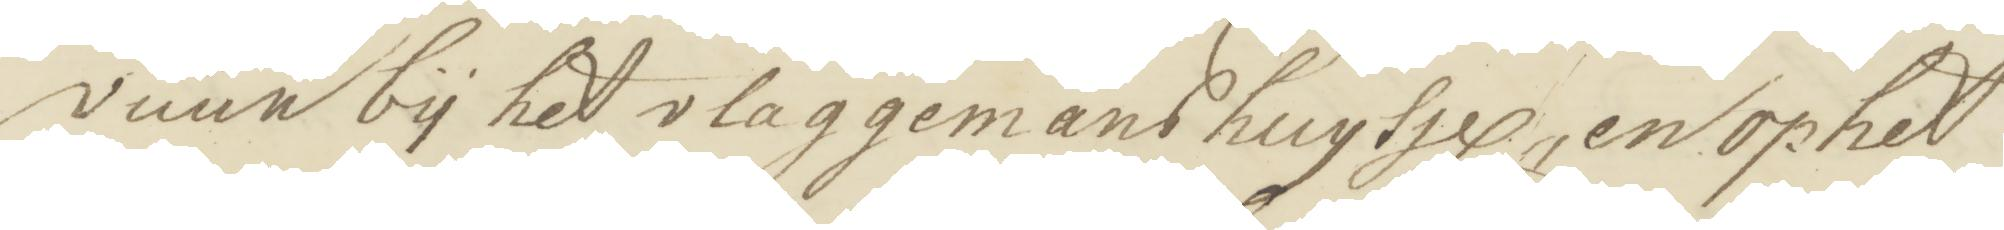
vuur bij het vlaggemanshuijsje, en op het
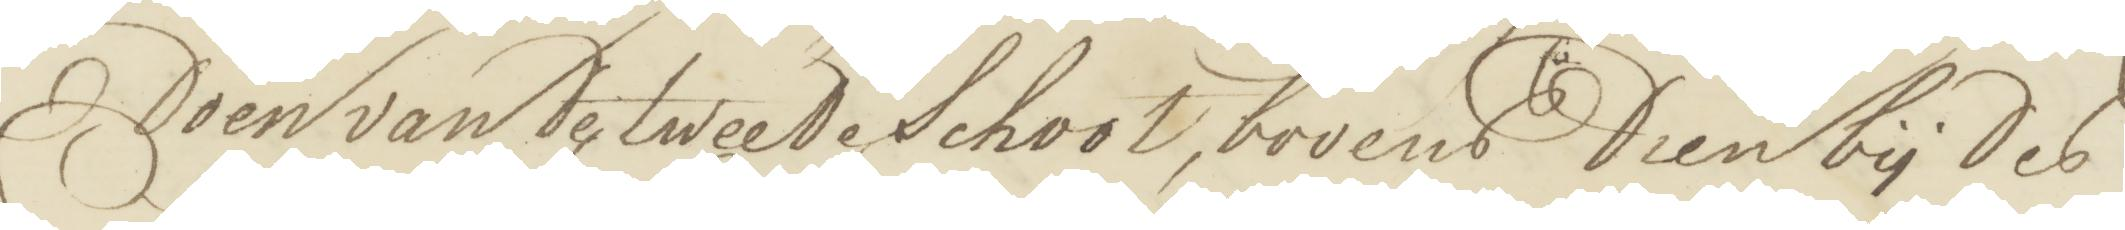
doen van de twee de schoot, bovens dien bij des
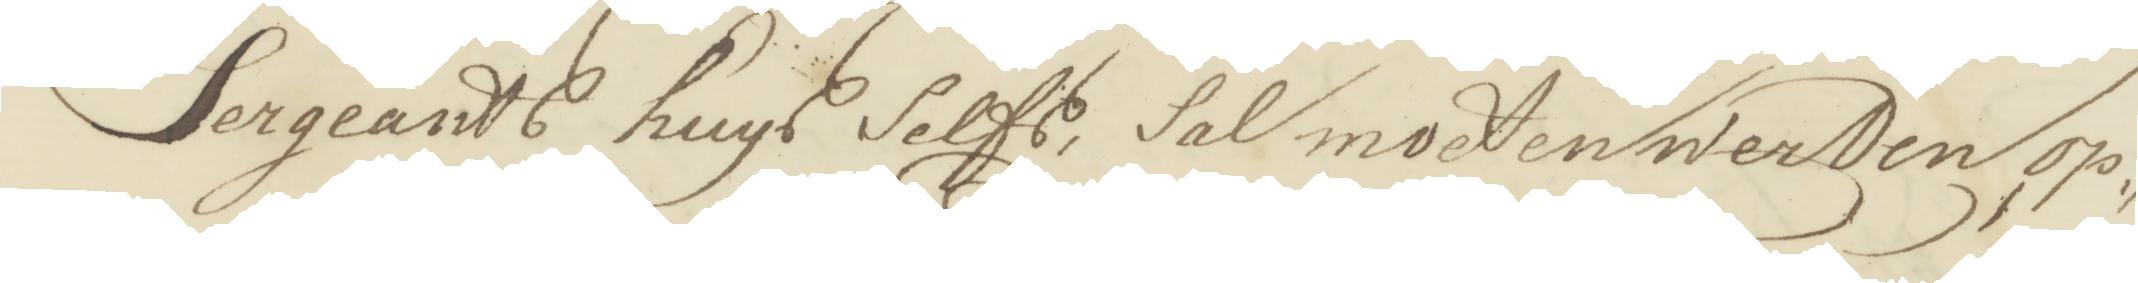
sergeants huijs selfs, sal moeten werden op„
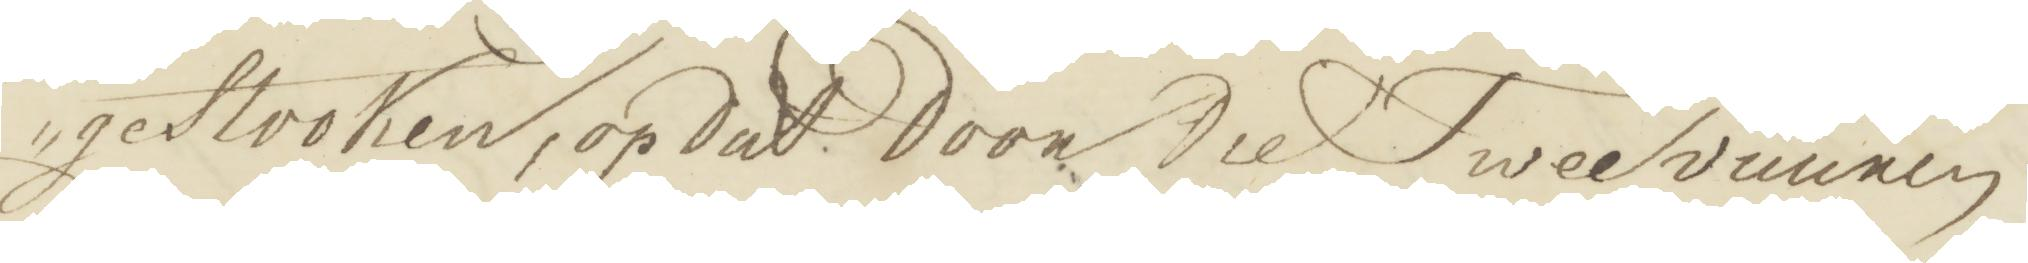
„gestooken, op dat door die Twee vuuren
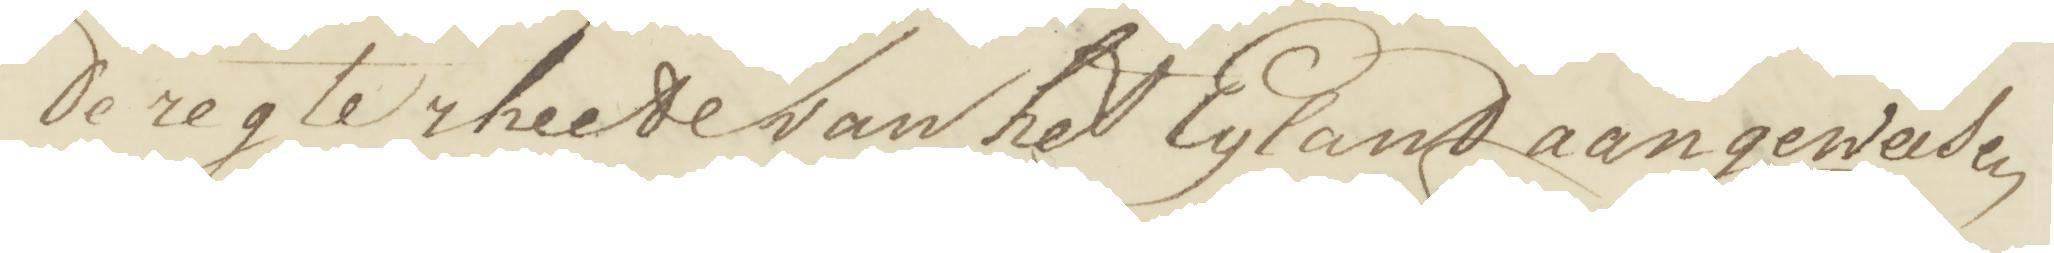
de regte rheede van het Eyland aan geweesen
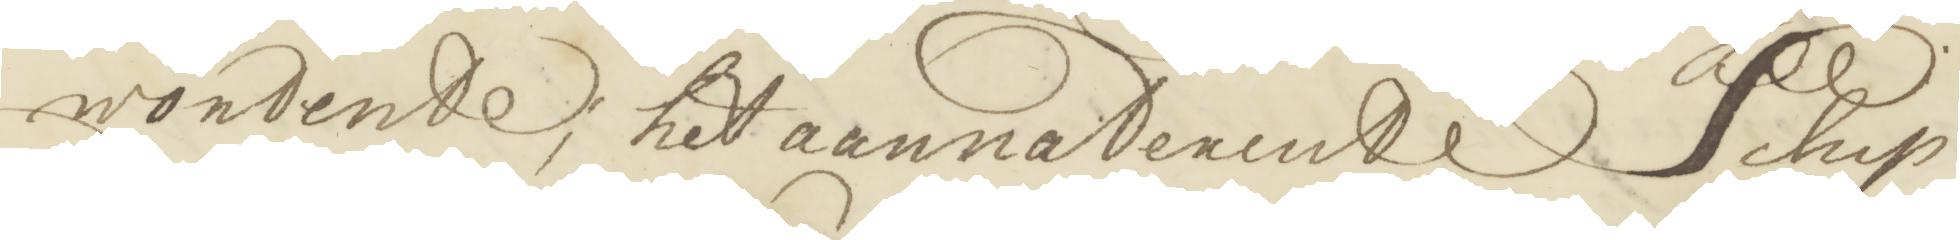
wordende, het aannaderende schip
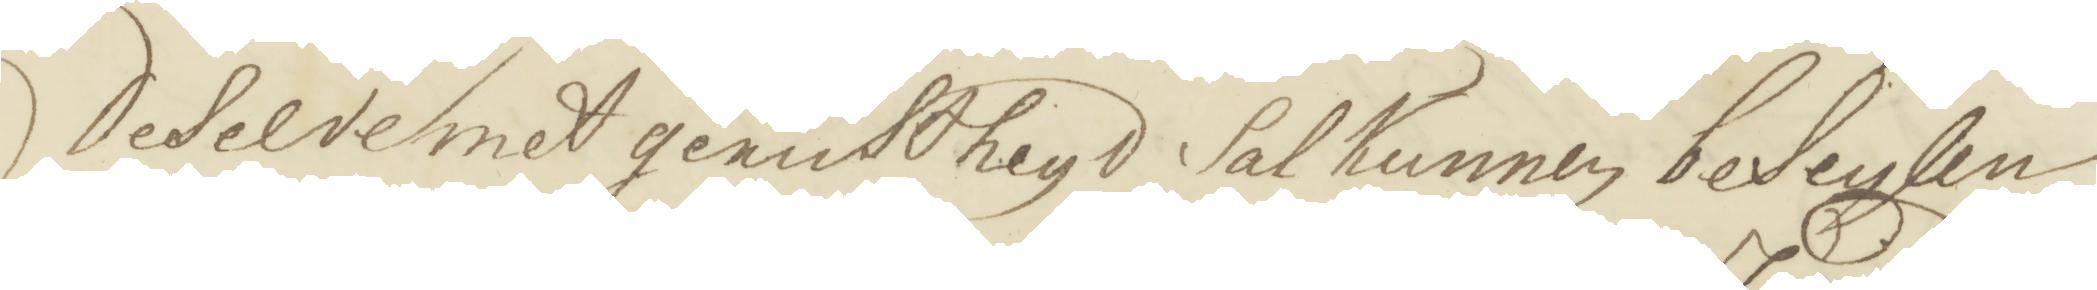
deselve met gerustheijd sal kunnen beseijlen,
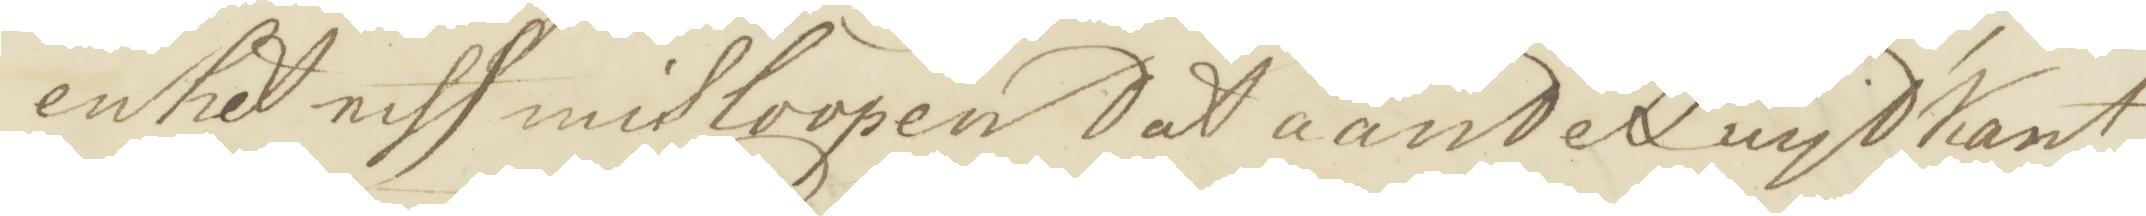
en het riff misloopen dat aan de zuijdkant
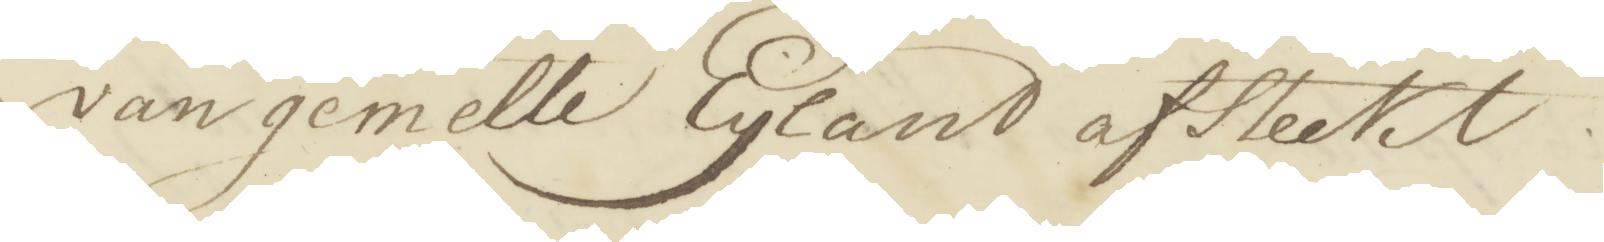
van gemelte Eijland afsteekt
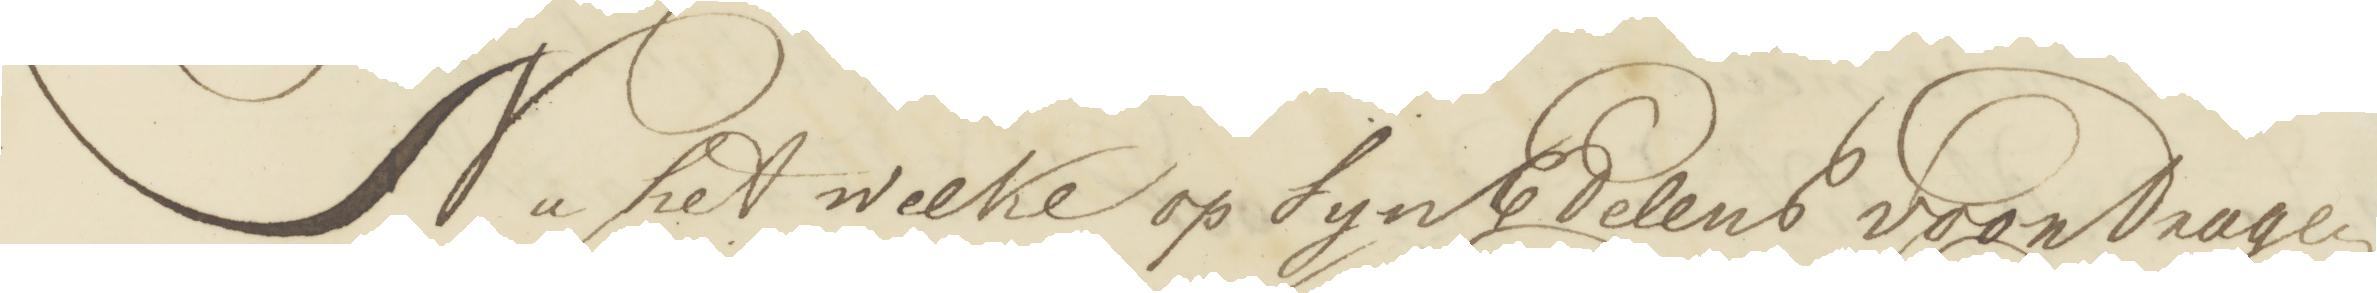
Na het welke op sijn Edelens voordragen
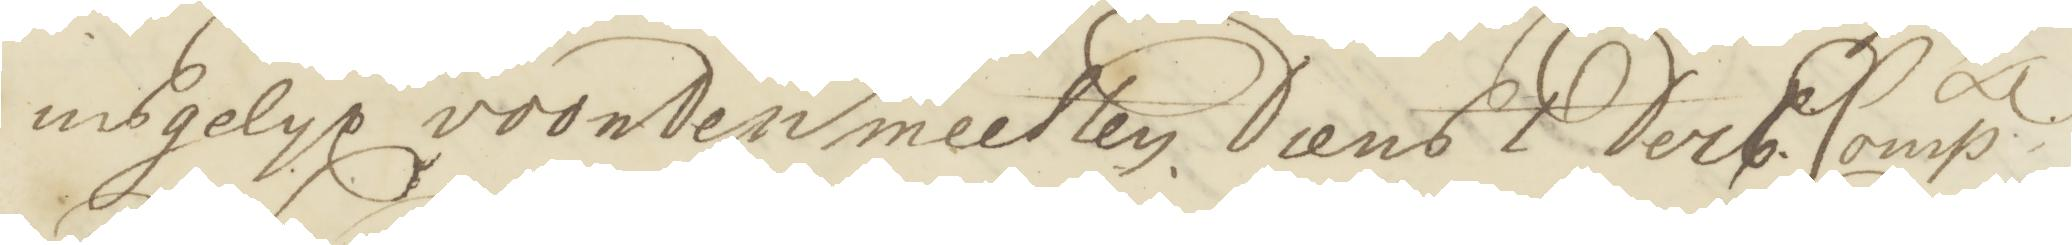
insgelijx voorden meesten dienst der E. Comp:e
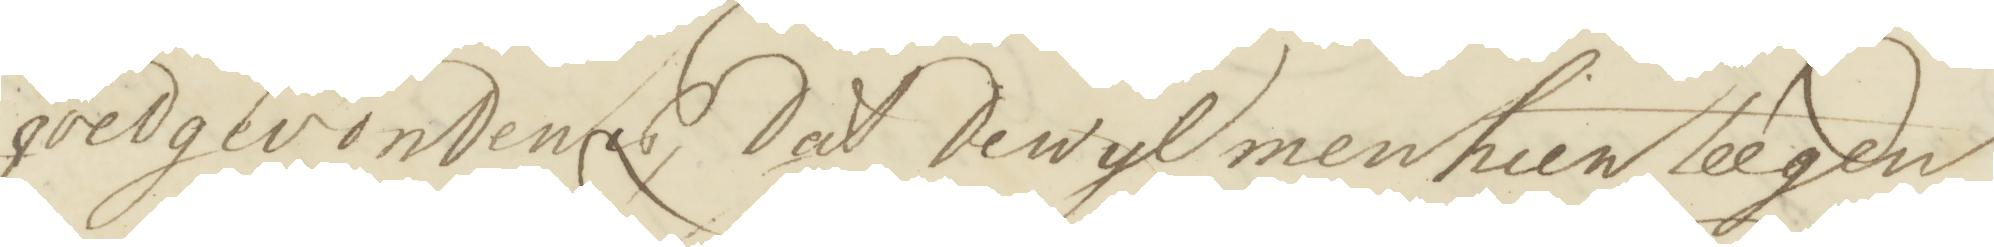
goedgevonden is, dat dewijl men hier teegen
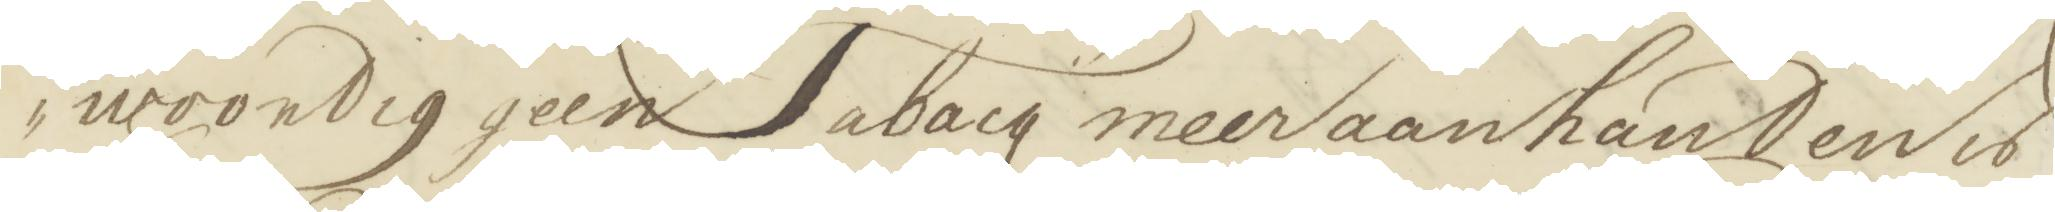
„woordig geen Tabacq meer aanhanden is
